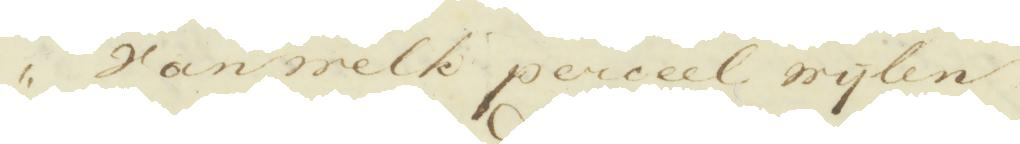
„ Van welk perceel wijlen
